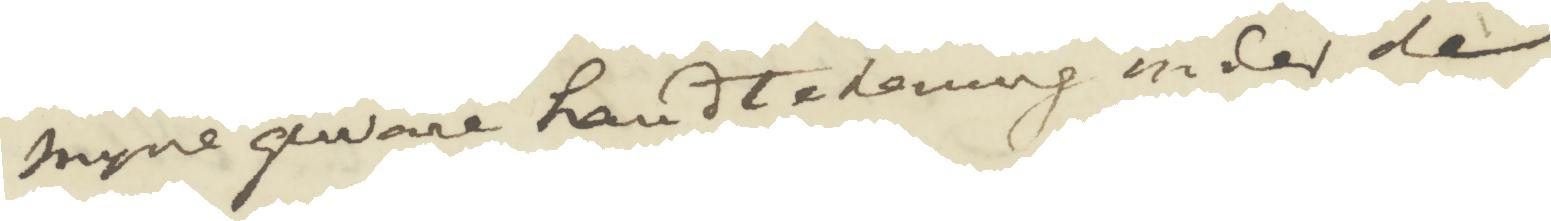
myne gewone handtekening onder de
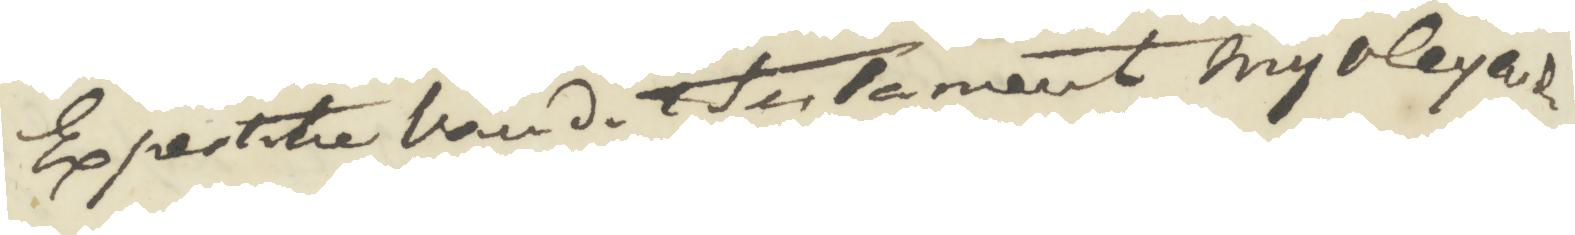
Expertitie van dit Testament my vleyende
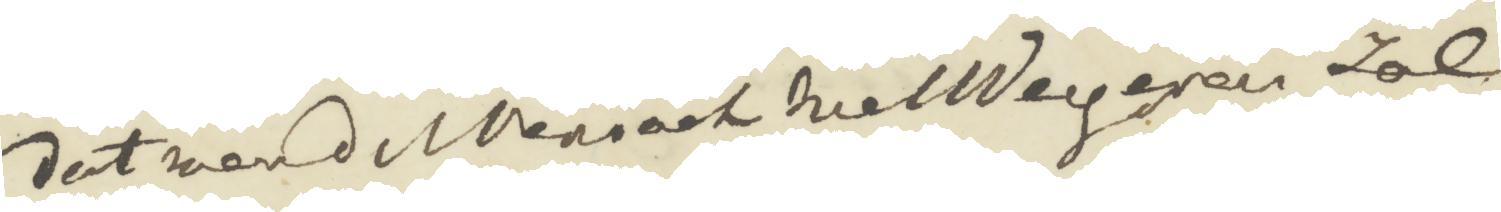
dat men dit versoek niet Weigeren zal
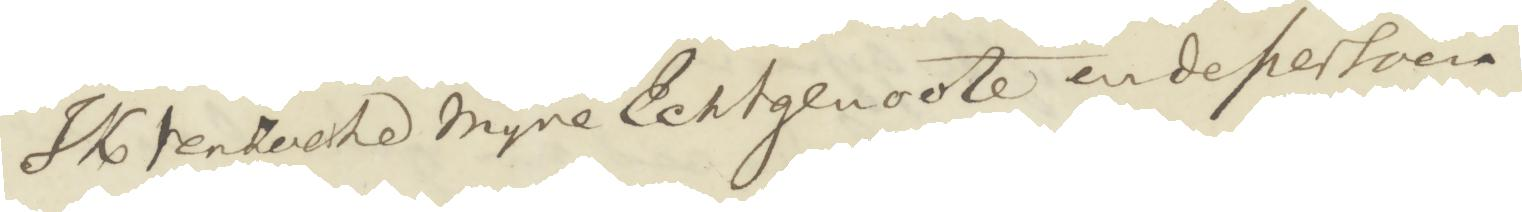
Ik verzoeke myne Echtgenoote en de persoon
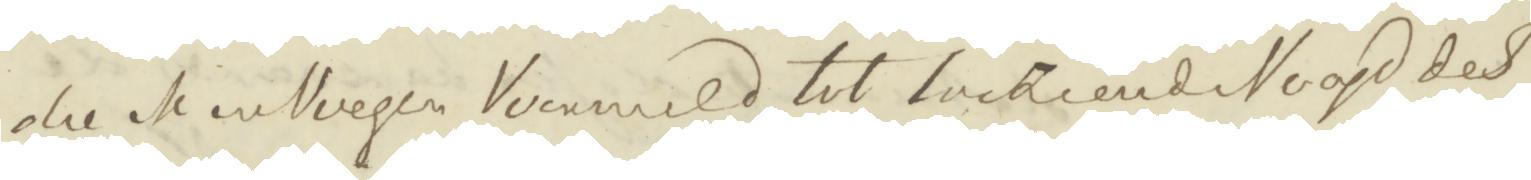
die ik in Voegen Voormeld tot toeziende Voogd des
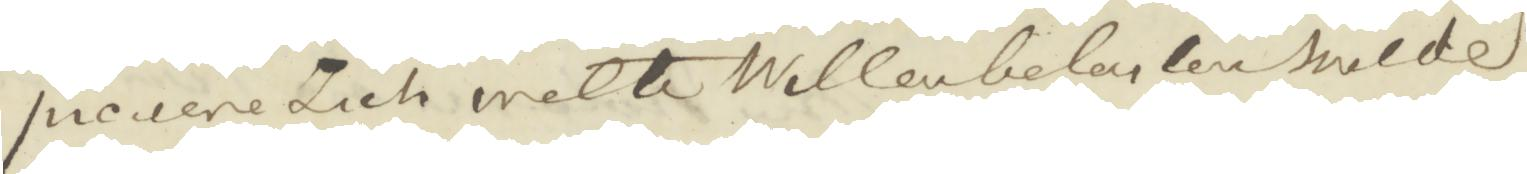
piceere zich wel te willen belasten met de
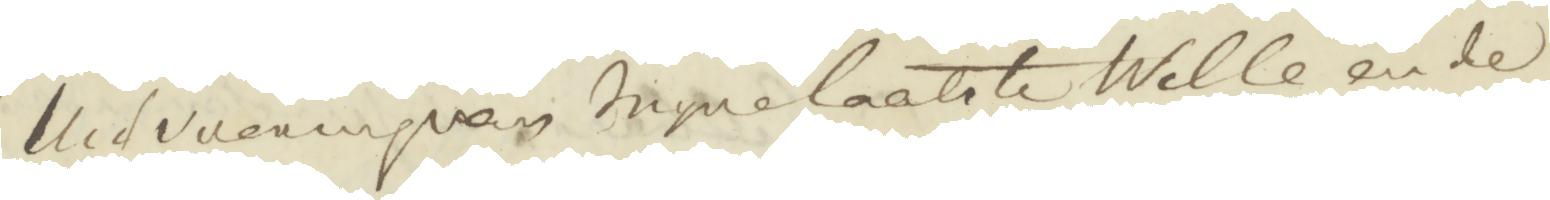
Uitvoering van myne laatste Wille en de
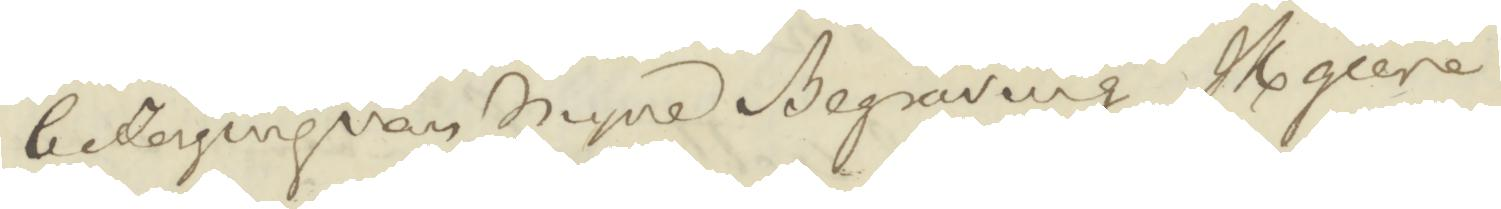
bezorging van myne Begraving Jk geeve
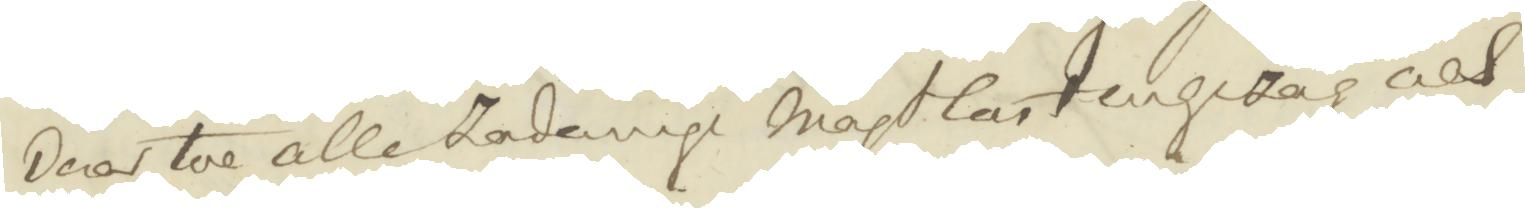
daer toe alle zodanige magt last en gezag als
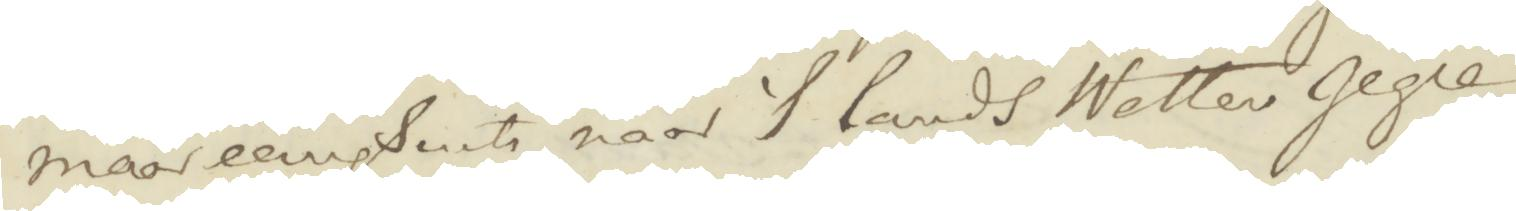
maar eenigsints naar 's lants wetten gegee
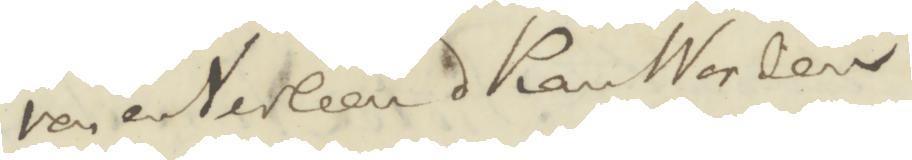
ven en Verleend kan Worden
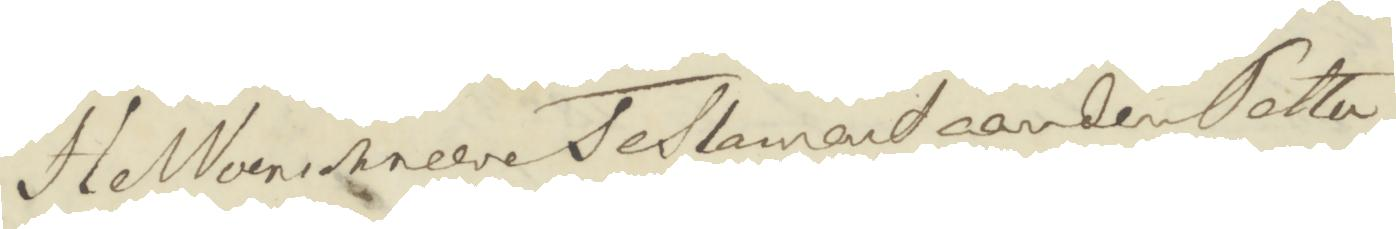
Het Voorschreeve Testament aan den Testa
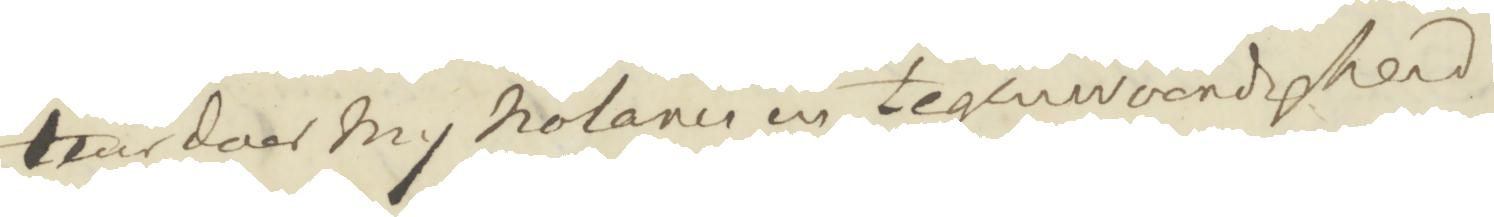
teur door my notaris in tegenwoordigheid
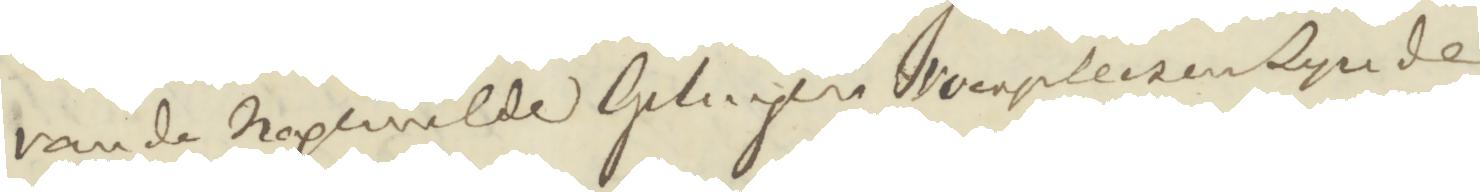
van de nagemelde Getuigen voorgeleezen zynde
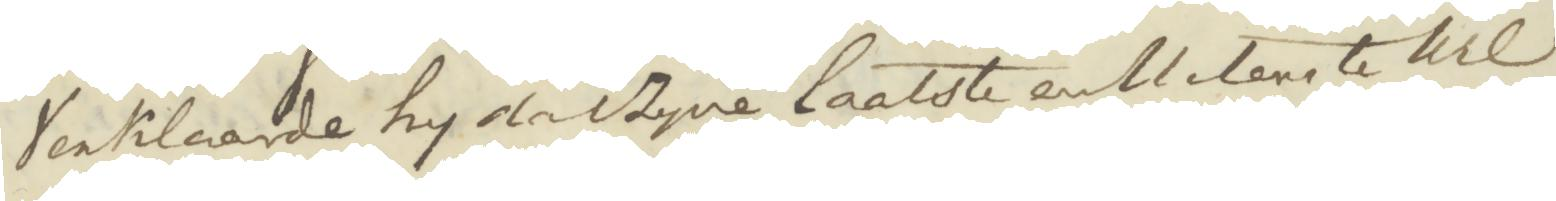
Verklaarde hy dat zyne laatste en uiterste wil
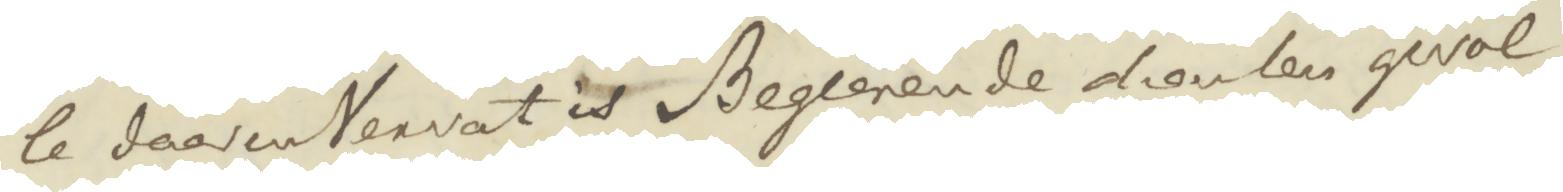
le daar in Vervat is Begeerende dien ten gevol
